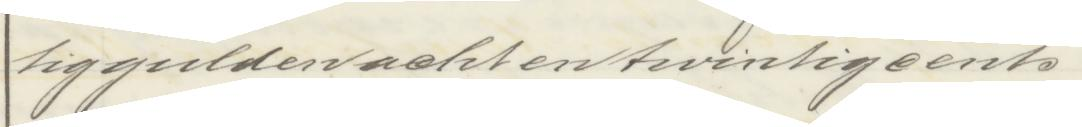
tig gulden acht en twintig cents
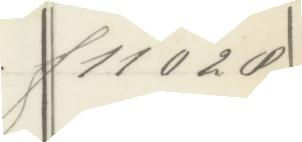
ƒ11028.
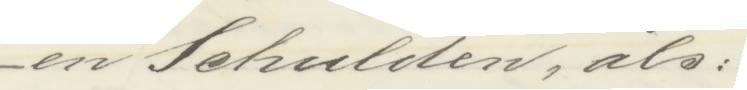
-en schulden, als:
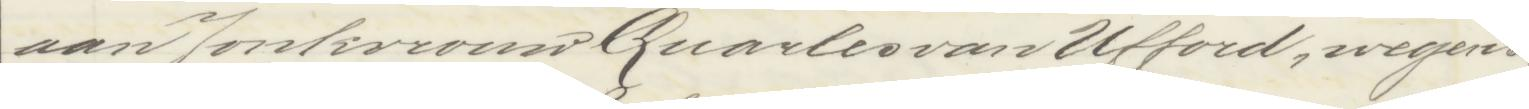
aan Jonkvrouw Quarles van Ufford, wegens
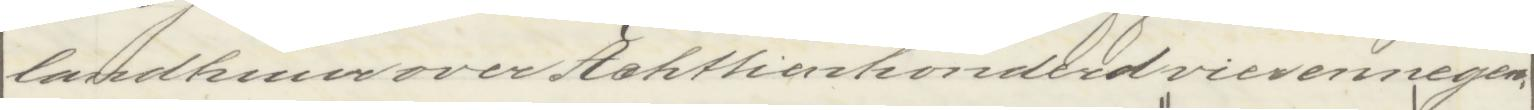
landhuur over Achttienhonderd vier en negen
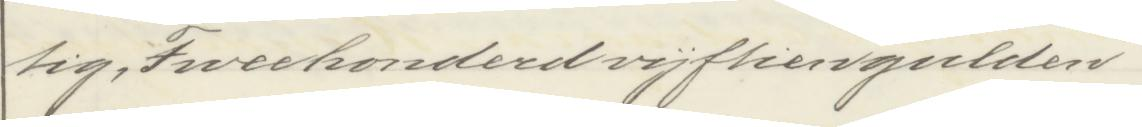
tig, Twee honderd vijftien gulden
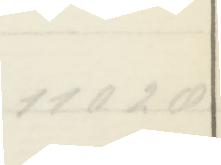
11028
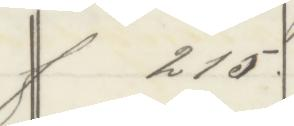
ƒ 215.
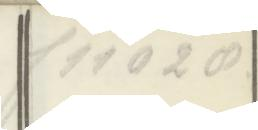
ƒ11028
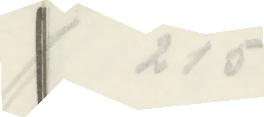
ƒ 215
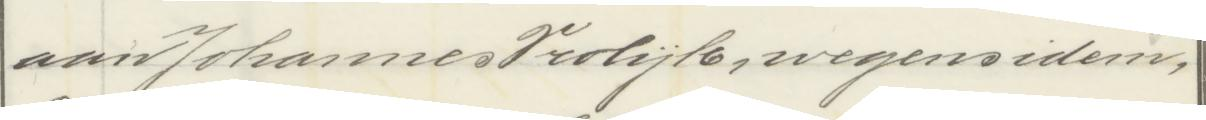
aan Johannes Vrolijk, wegens idem,
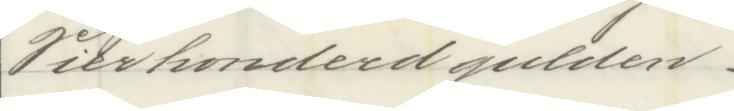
Vier honderd gulden
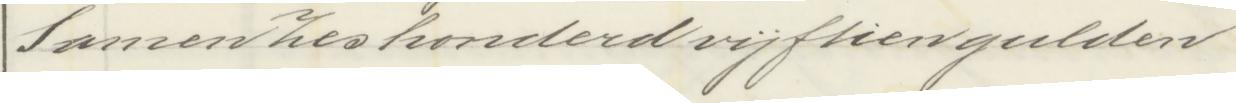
samen Zes honderd vijftien gulden
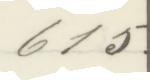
615
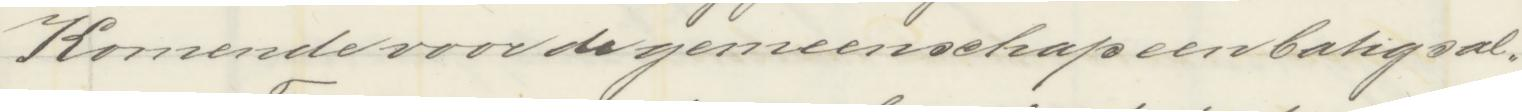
Komende voor de gemeenschap een batig sal„
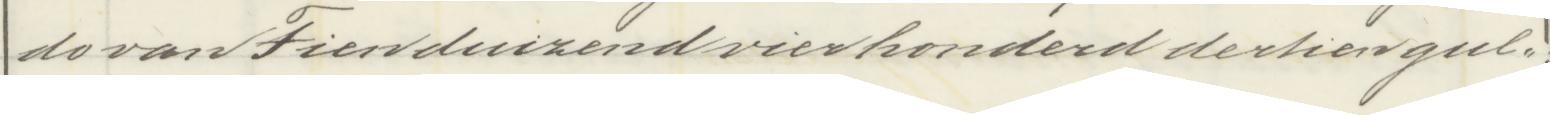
do van Tien duizend vier honderd dertien gul„
